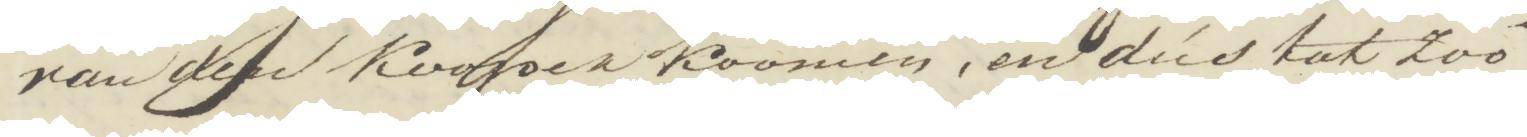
van den kooper koomen, en dus tot zoo
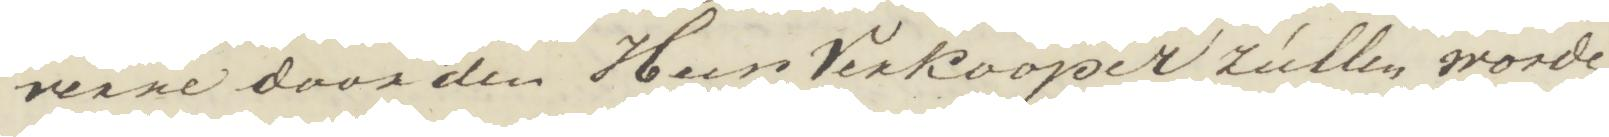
verre door den Heer Verkooper zullen worden
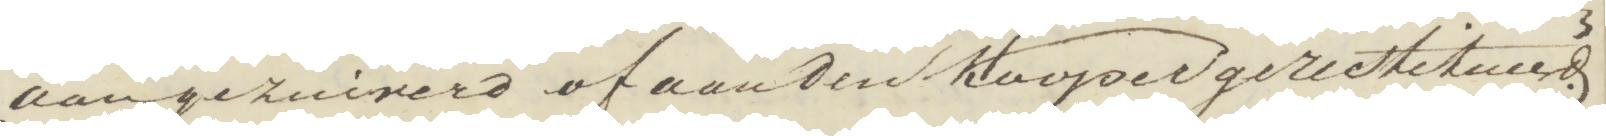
aangezuiverd of aan den kooper gerestitueerd.
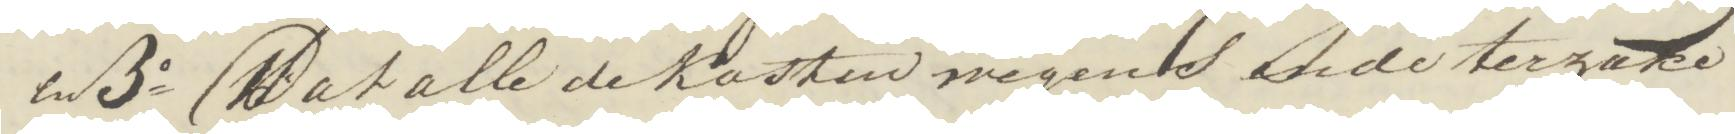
en 3=o Dat alle de kosten wegens ende terzake
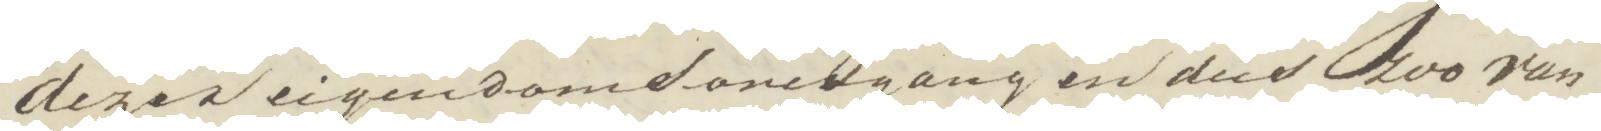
dezer eigendomsovergang en dus zoo van
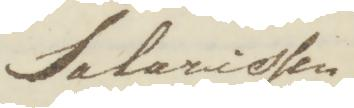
Salarissen
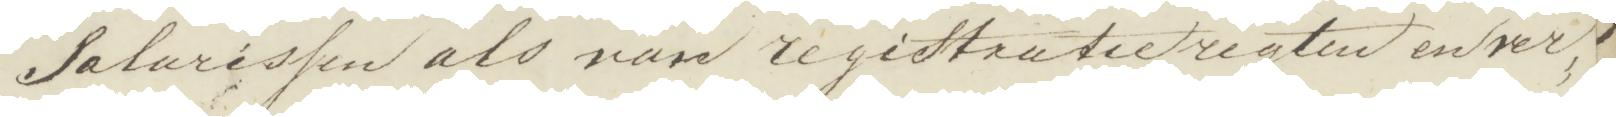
salarissen als van registratieregten en ver„
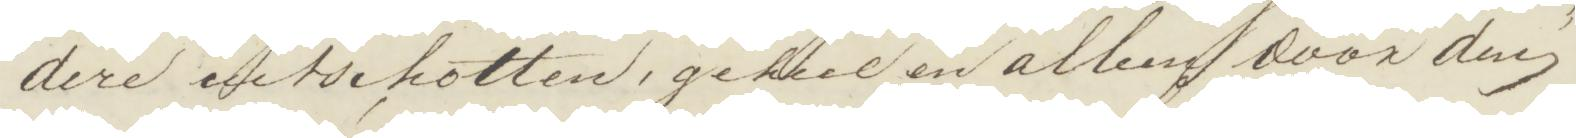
dere uitschotten, geheel en alleen door den
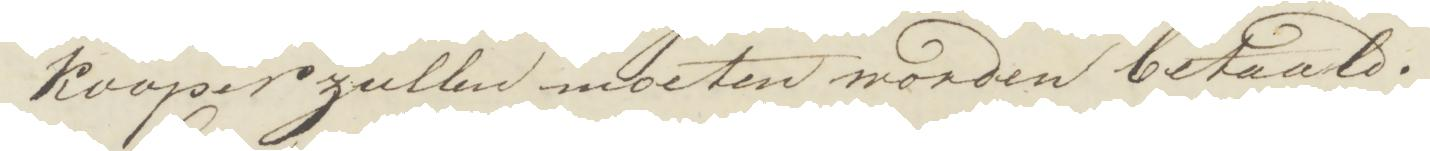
kooper zullen moeten worden betaald.
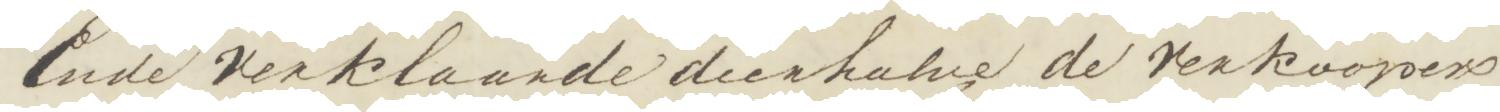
Ende verklaarde dierhalve de verkooper
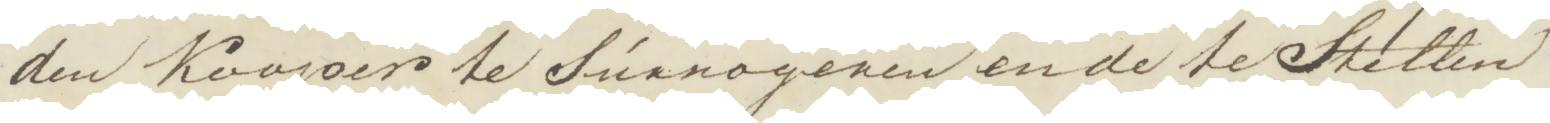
den kooper te surrogeren ende te stellen
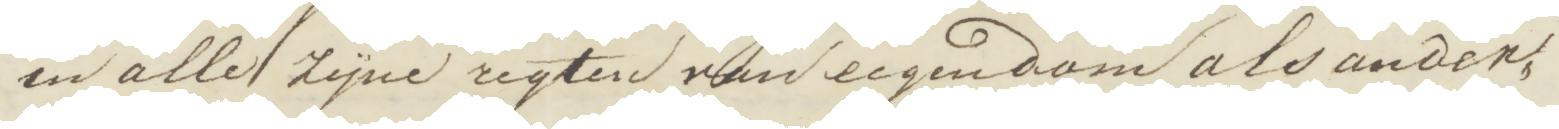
en alle zijne regten van eigendom als ander„
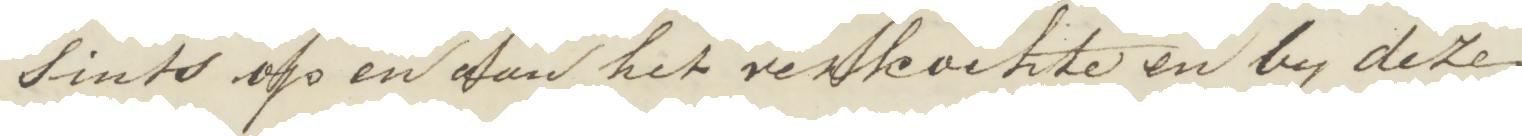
sints op en aan het verkochte en by deze
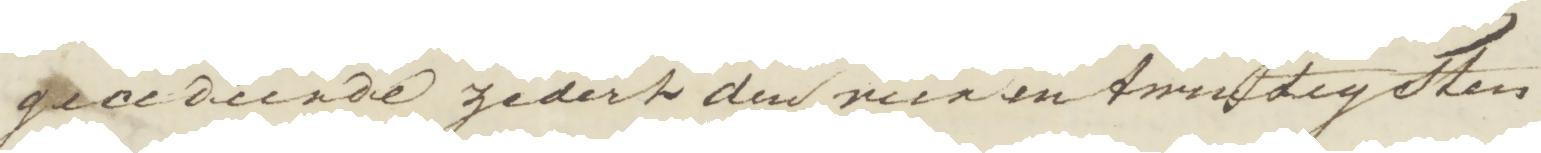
gecedeerde zedert den vier en twintigsten
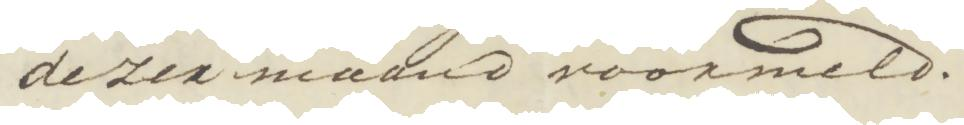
dezer maand voormeld.
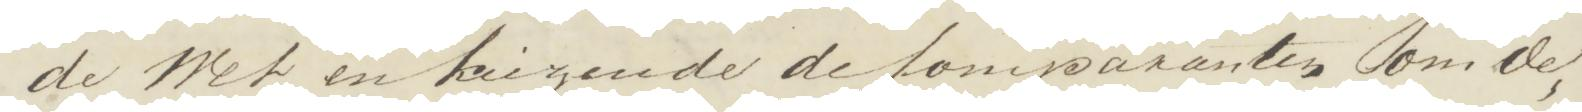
de Wet en kiezende de Comparanten om de„
